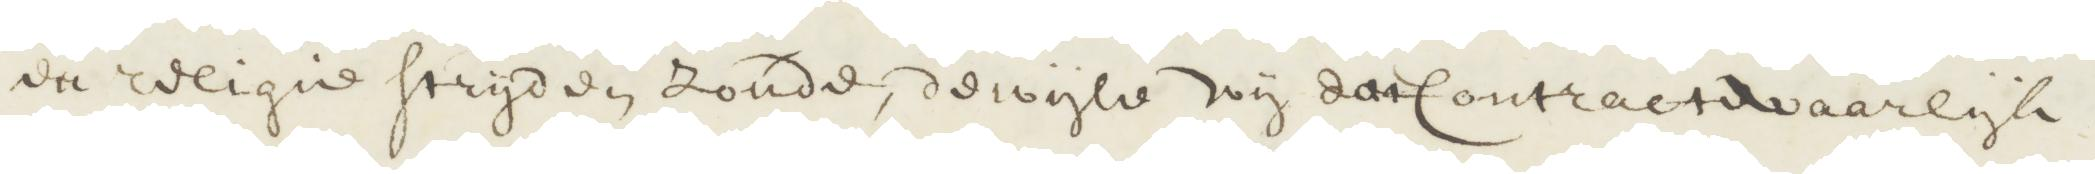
en religie strijden zoude, dewijle wij dat Contract waarlijk
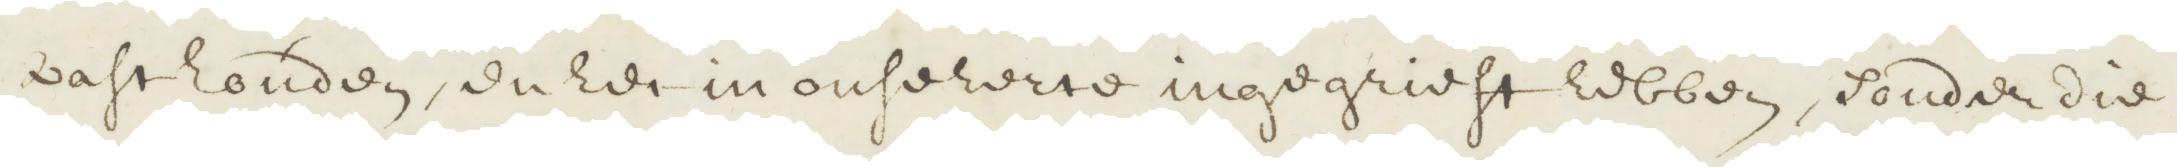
vasthouden, en het in onse herte ingegrieft hebben, sonder die
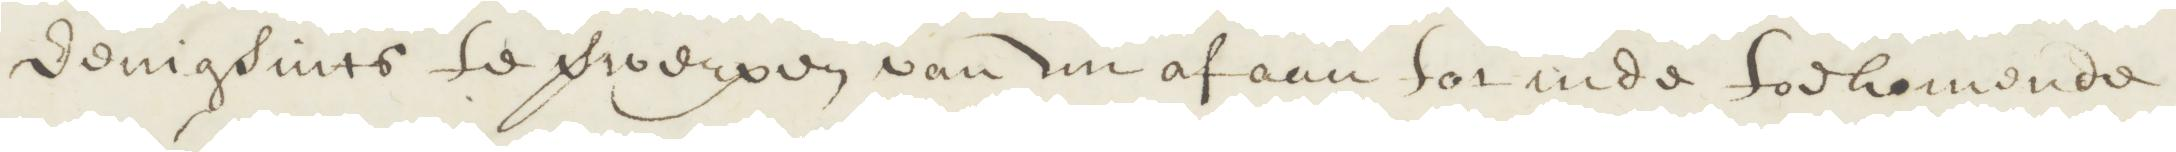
Eenigsints te verwerpen van nu af aan tot inde toekomende
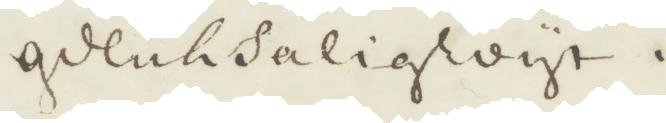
geluksaligheijt.
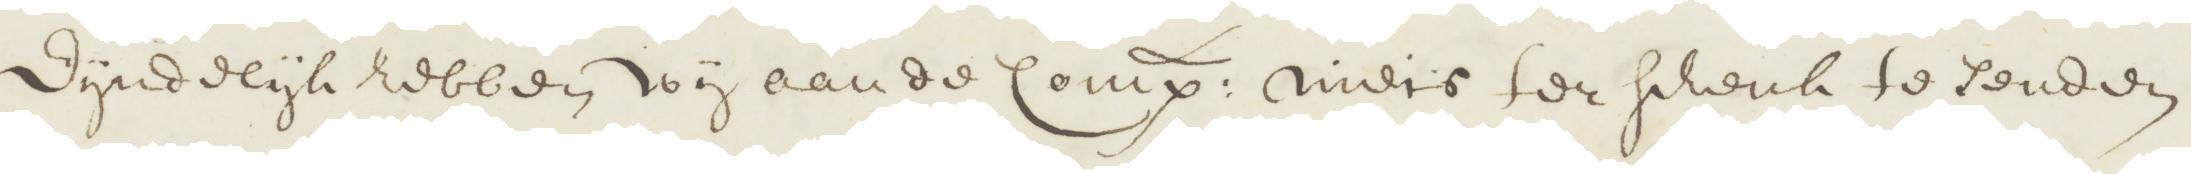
Eijndelijk hebben wij aan de Comp: niets ter schenk te senden
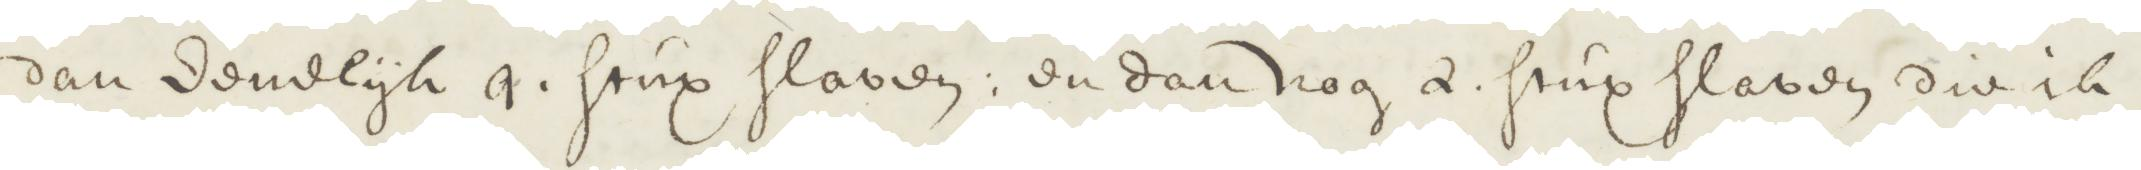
dan Eenelijk 4. stux slaven; en dan nog 2. stux slaven die ik
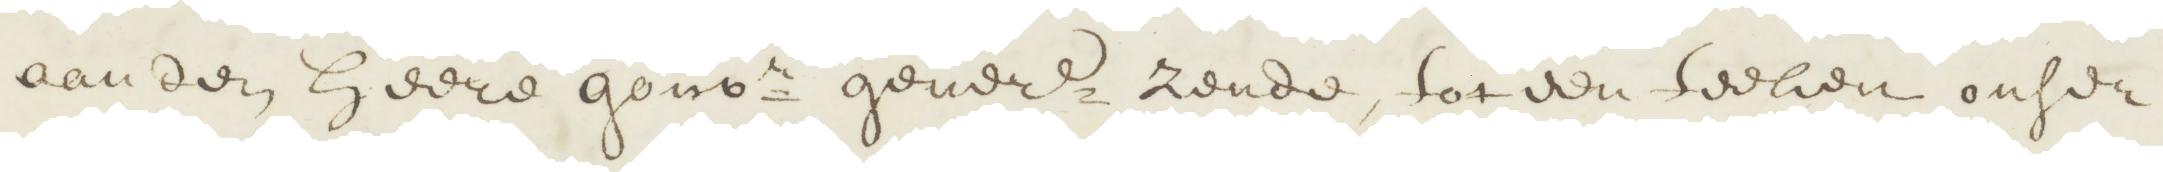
aan den heere gouv=r gener=l zende, tot een teeken onser
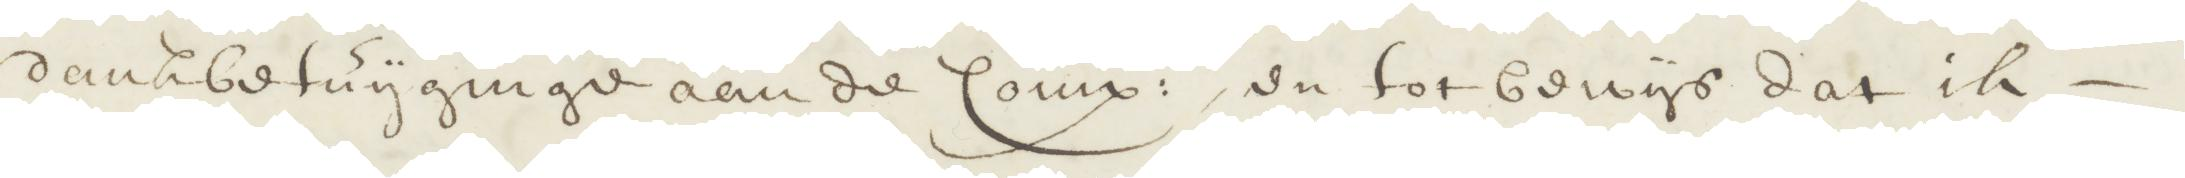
dank betuijginge aan de Comp:, en tot bewijs dat ik —
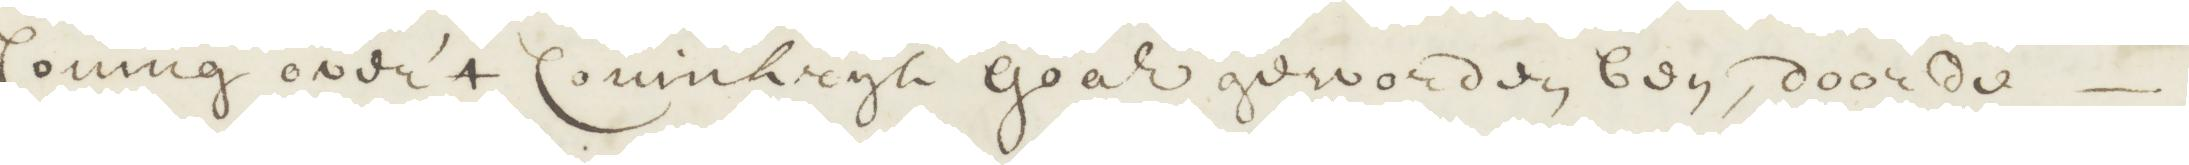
Coning over ’t Coninkrijk goah geworden ben, door de —
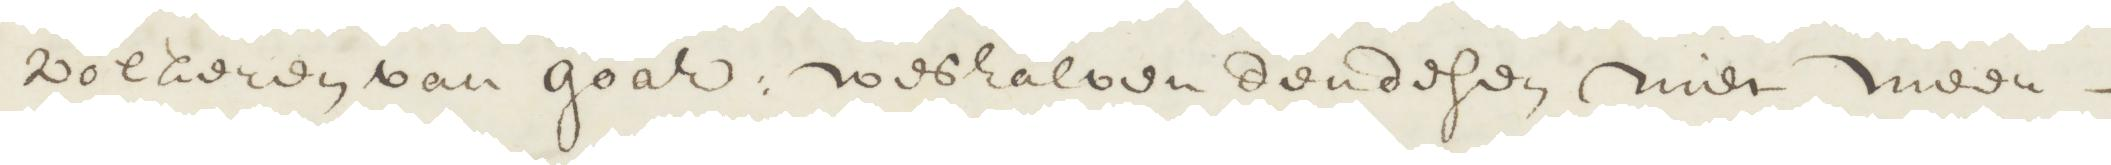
volkeren van goah:t weshalven den desen niet meer
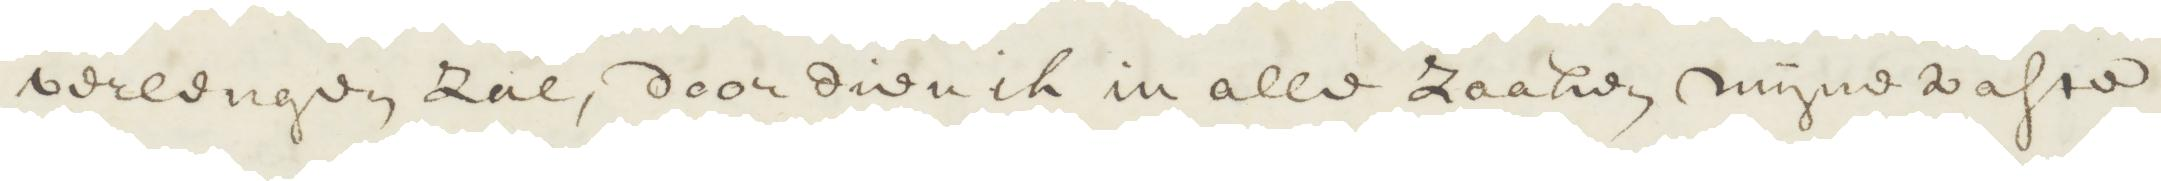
verlengen zal, door dien ik in alle zaaken mijne vaste
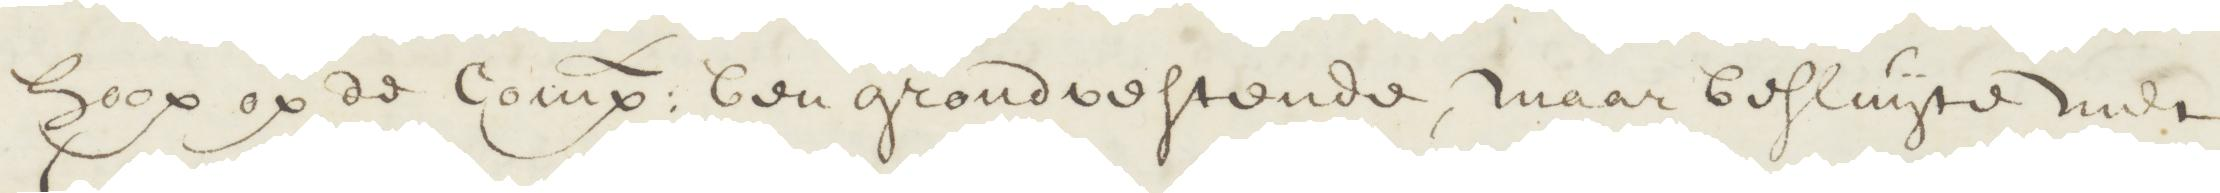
hoop op de Comp: ben grondvestende, maar besluijte met
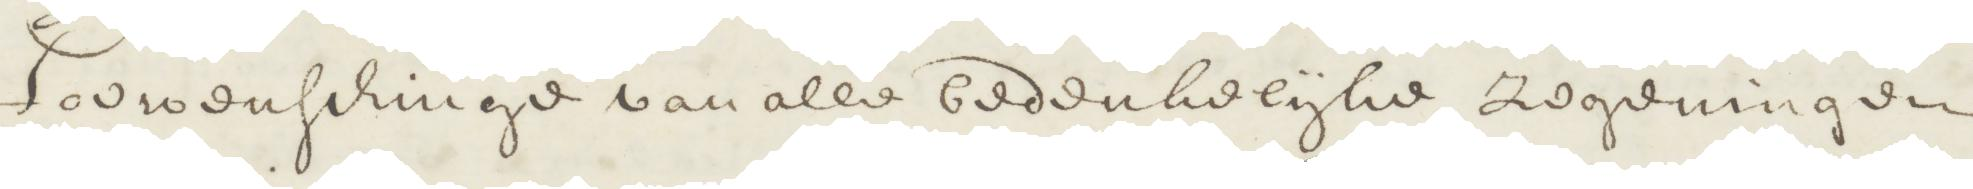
toewenschinge van alle bedenkelijke zegeningen
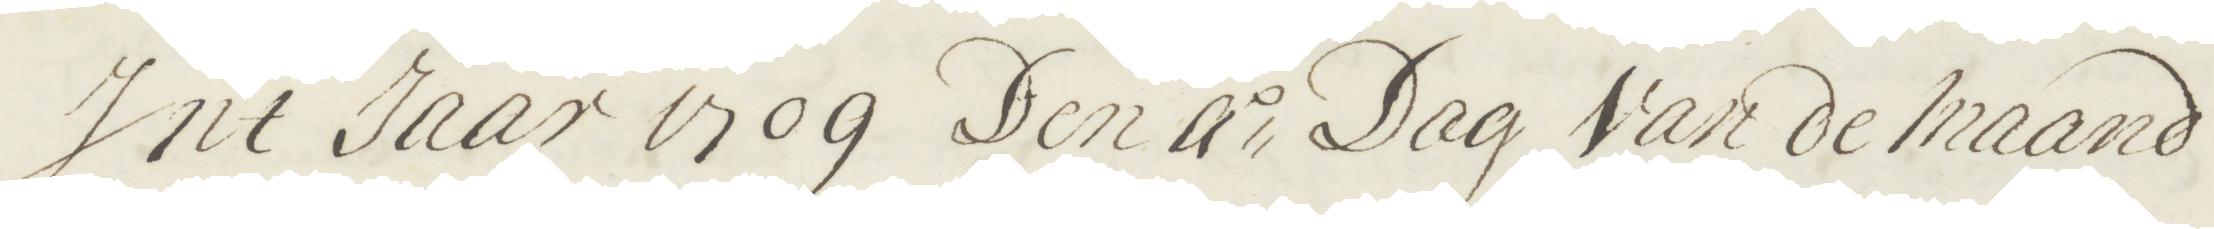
Jn't Jaar 1709 Den a„o Dag van de maand
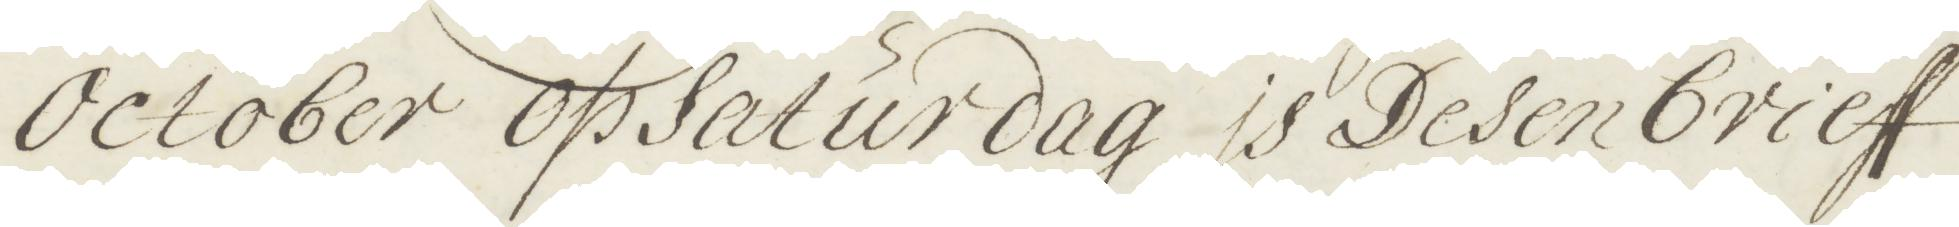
October op saturdag js Desen brieff
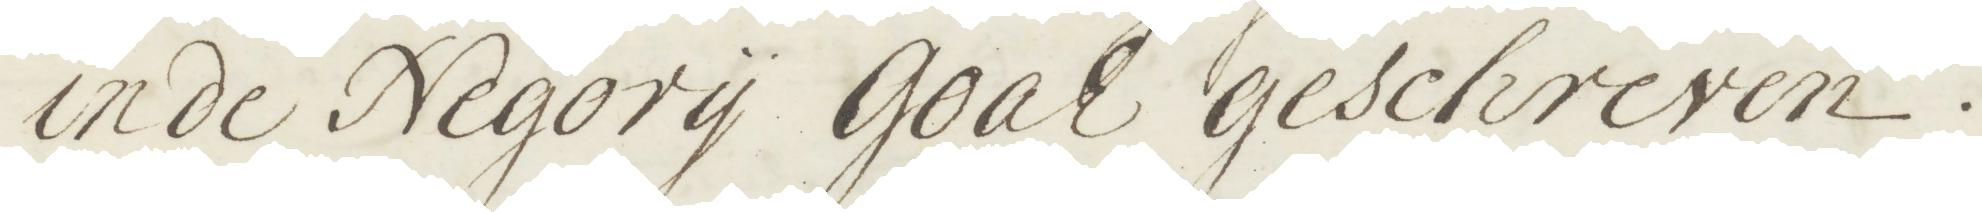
in de Negorij Goah geschreven.
